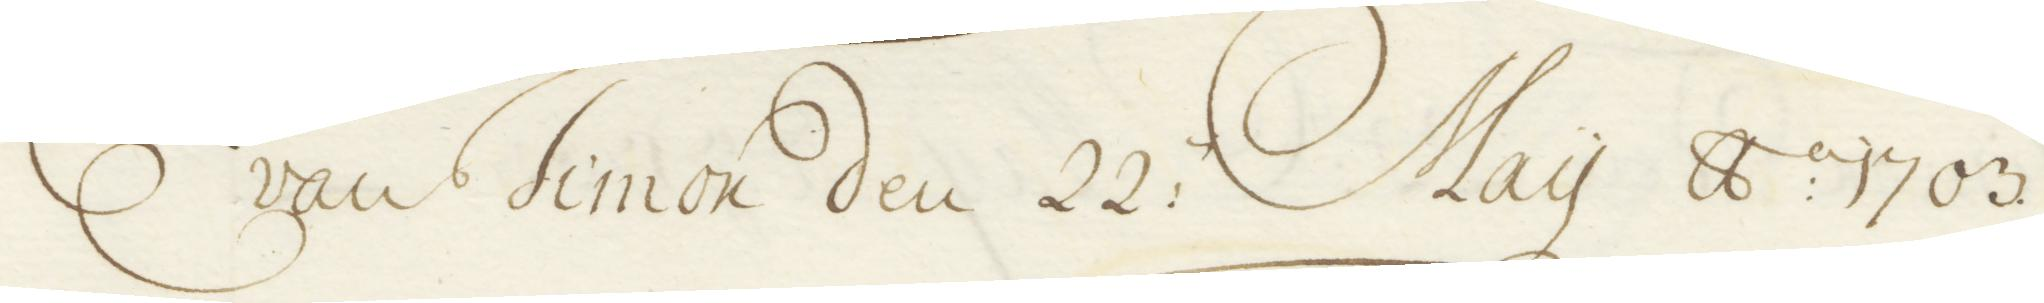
van Timor den 22:' Maij A:o 1703.
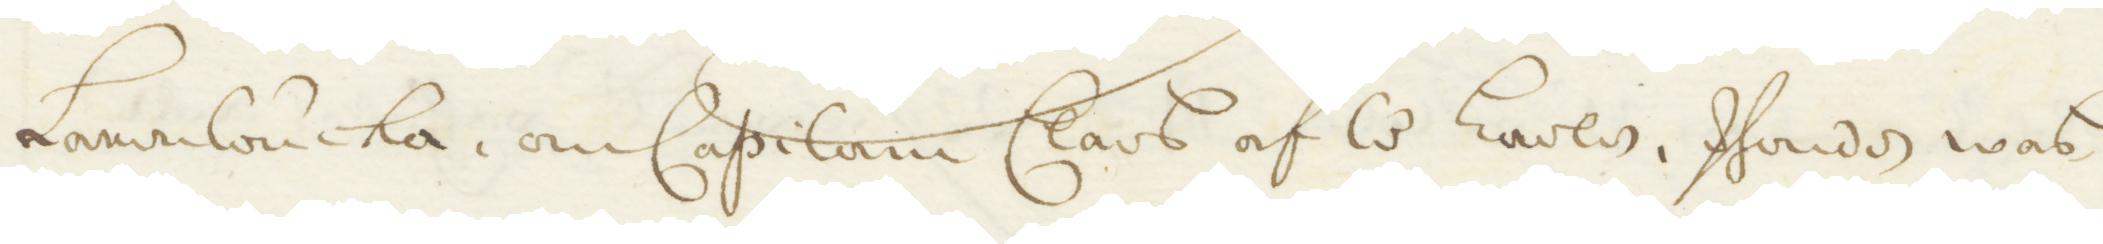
Lorenloucka, om Capitain Claes af te haelen, versonden was
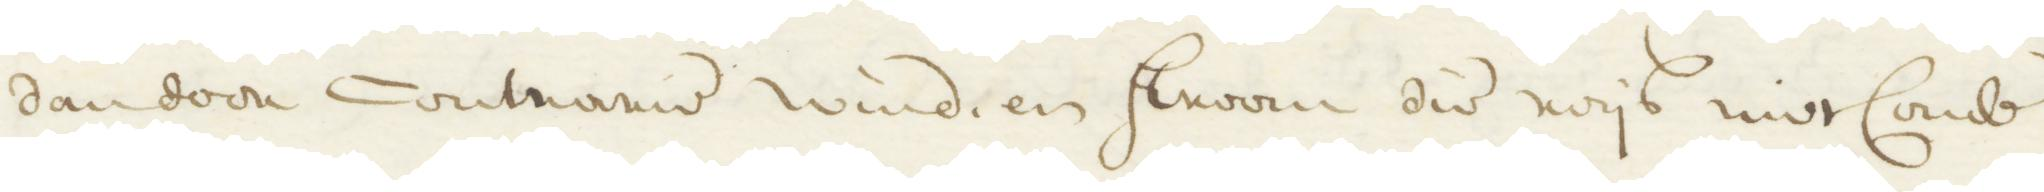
dan door contrarie wind, en stroom die reijs niet Conde
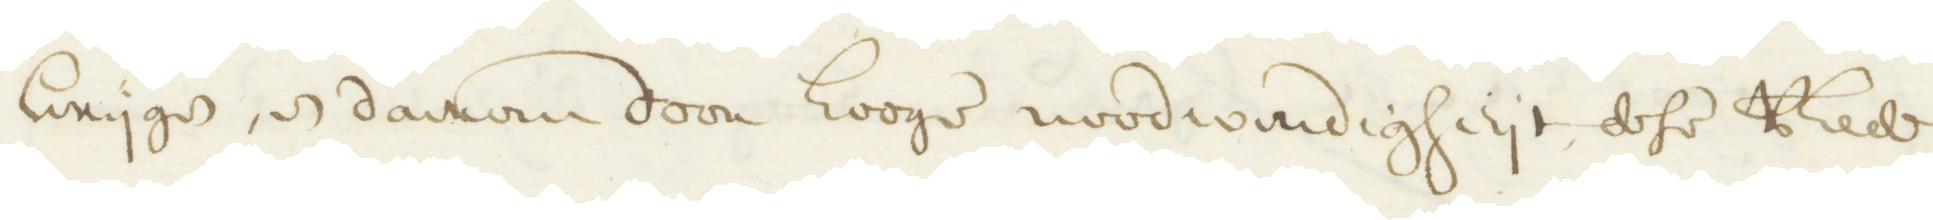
krijgen, en daerom door hooge noodwendigheijt, dese Rhede
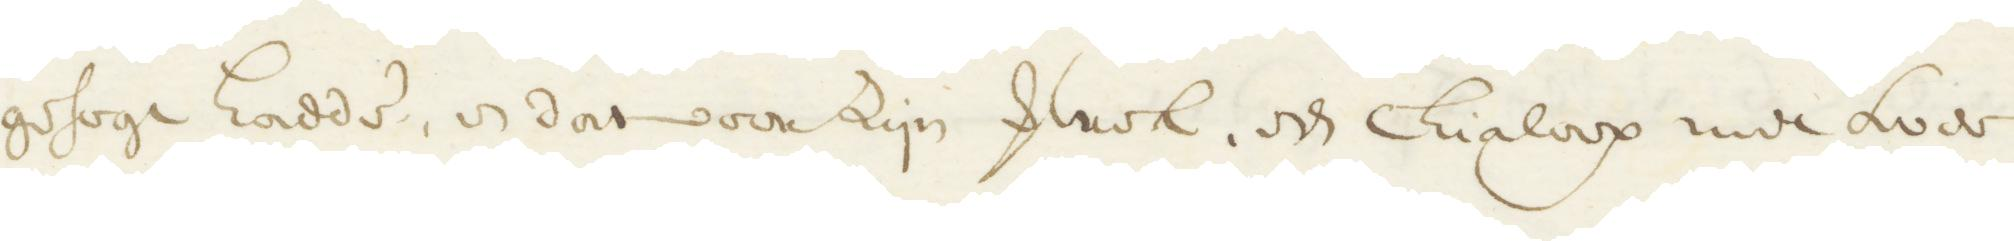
gesogt hadde, en dat voor zijn vertrek, een Chialoup met twee
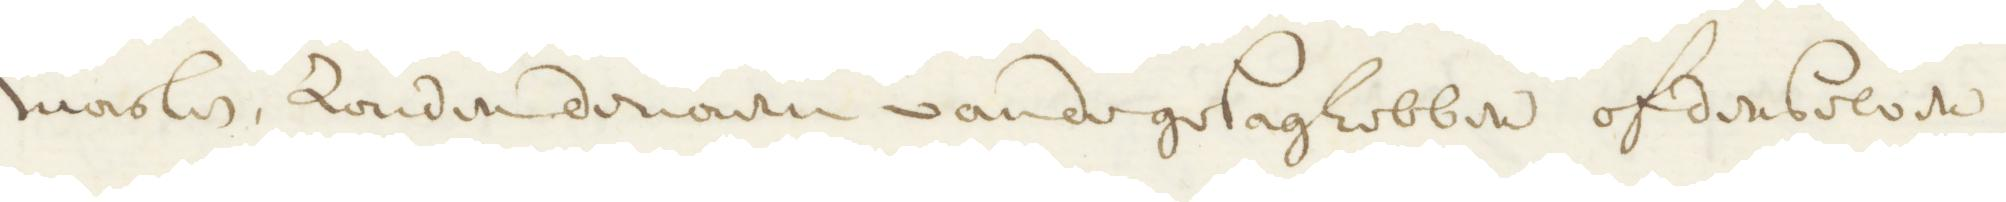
masten, zonder de naem van de gesaghebber of derselver
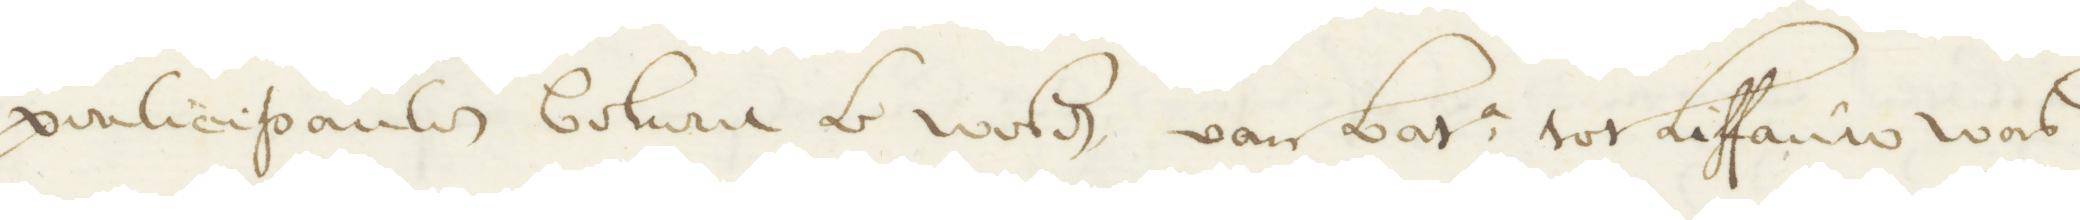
participanten bekent te wesen, van bat:a tot liffauw was
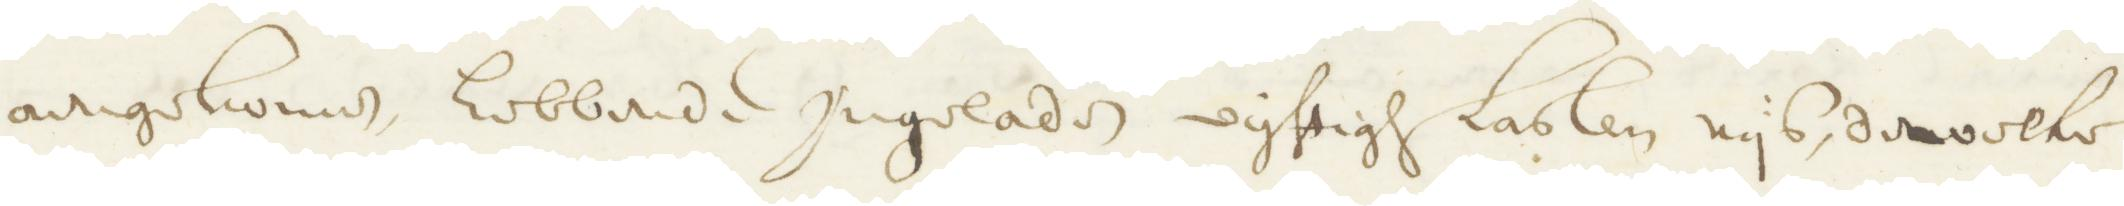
aengekomen, hebbende jngeladen vijftigh lasten rijs, dewelke
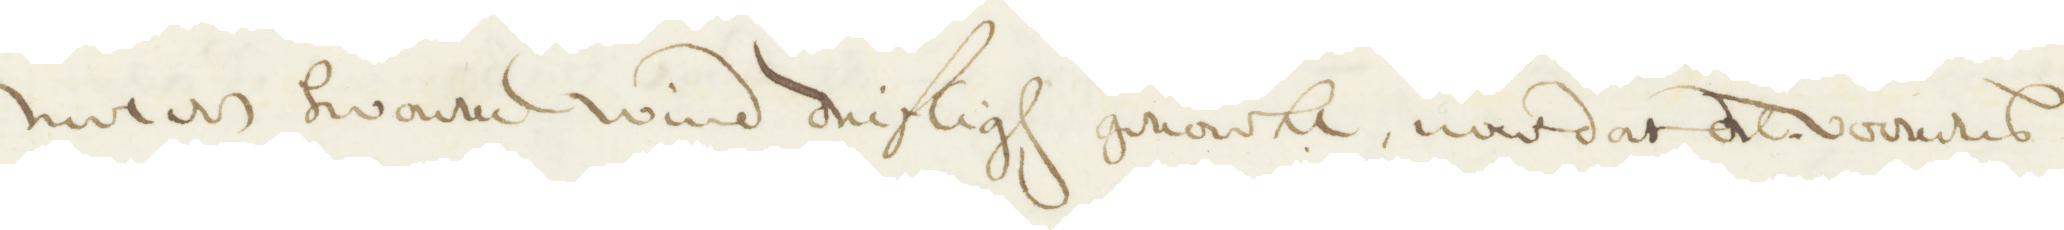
met een swaere wind driftigh geraekt, nae dat de voorens
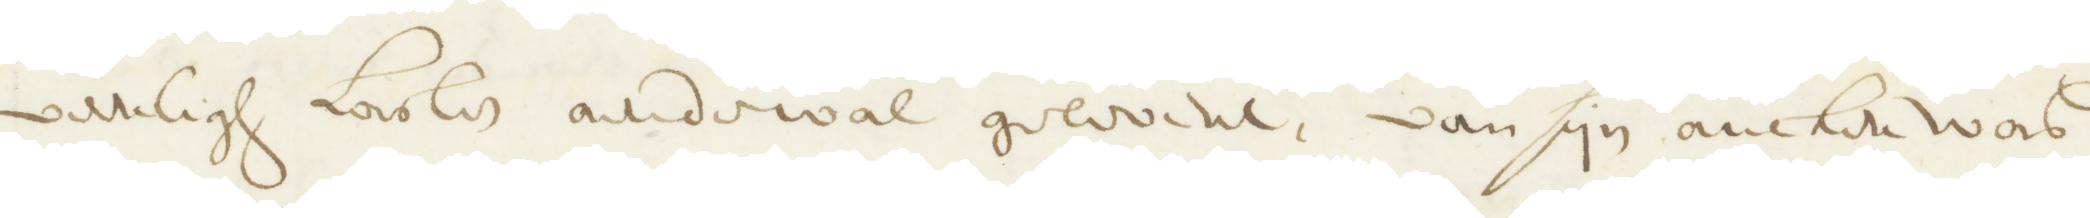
veertigh lasten aen de wal gelevert, van sijn ancker was
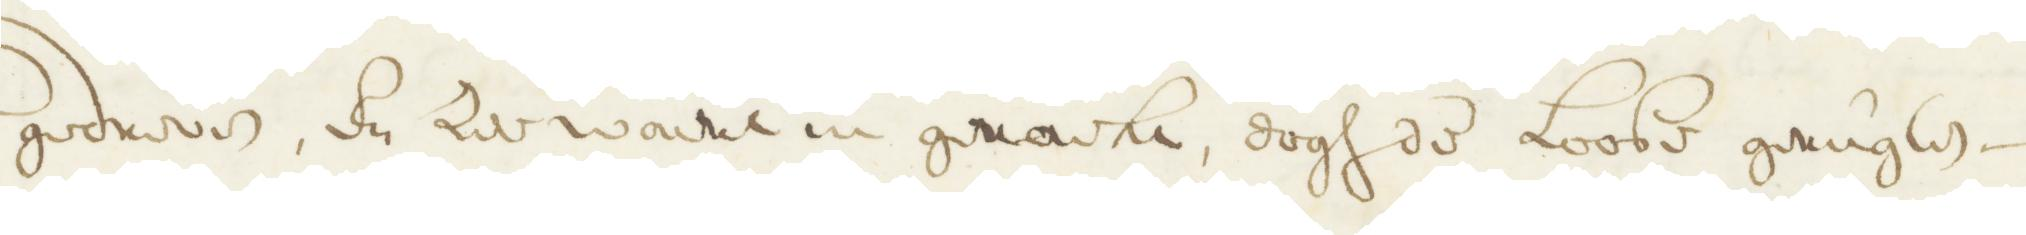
gedreven, En zeewaert in geraekt, dogh de loose gerugten
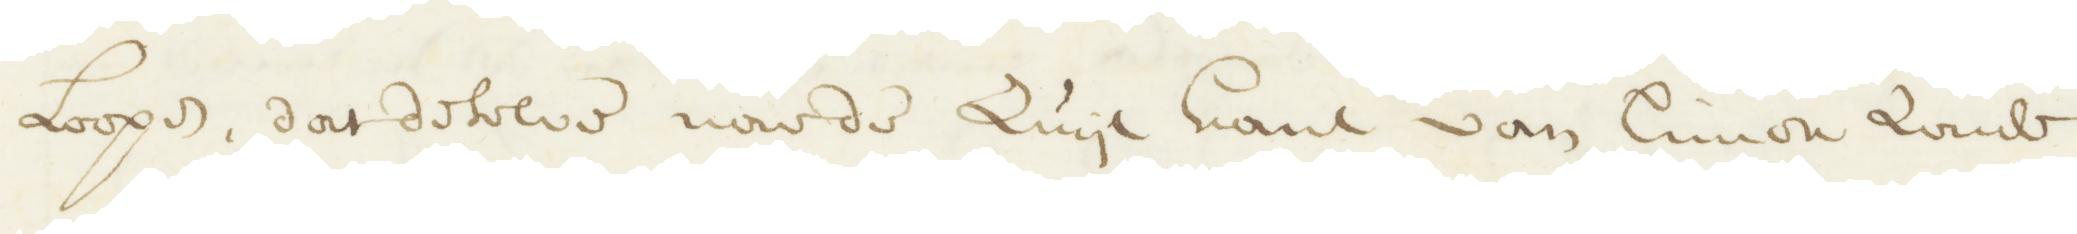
loopen, dat deselve nae de zuijt kant van Timor zoude
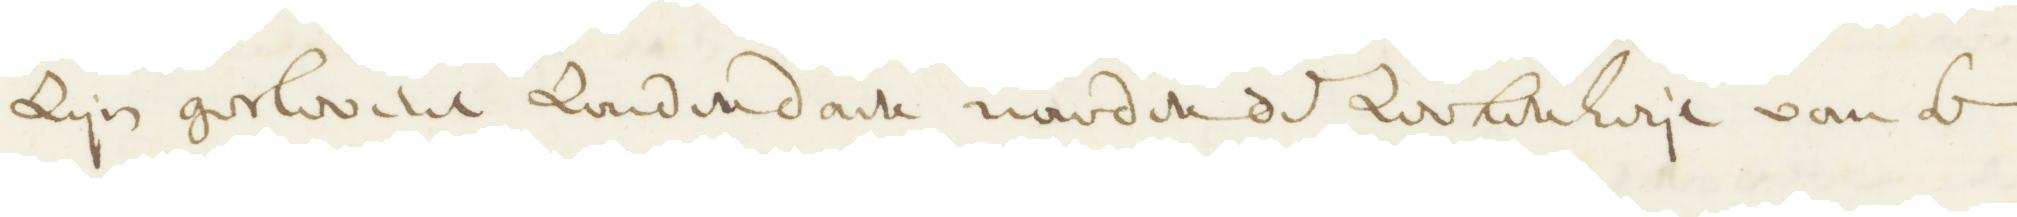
zijn gesleeckt zonder daer naeder de zeekerheijt van te
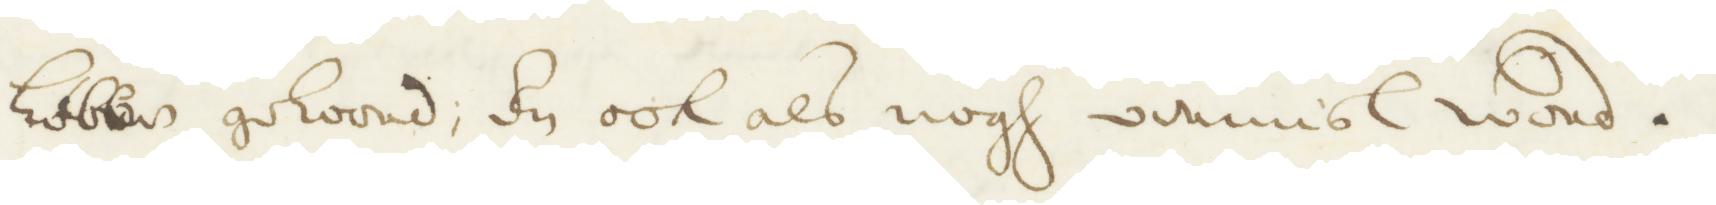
hebben gehoord; En ook als nogh vermist word.
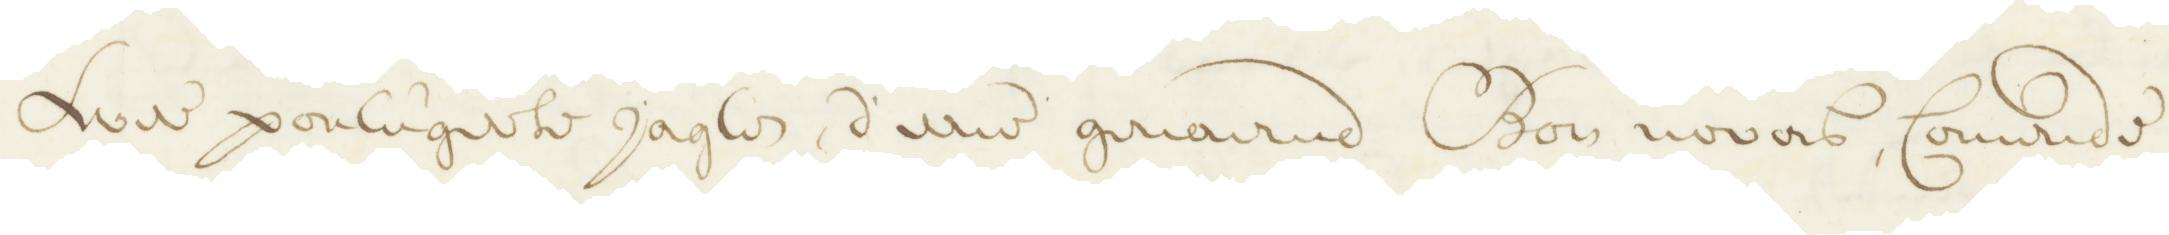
twee portugeese jagten, d’ eene genaemd Bon novas, Comende
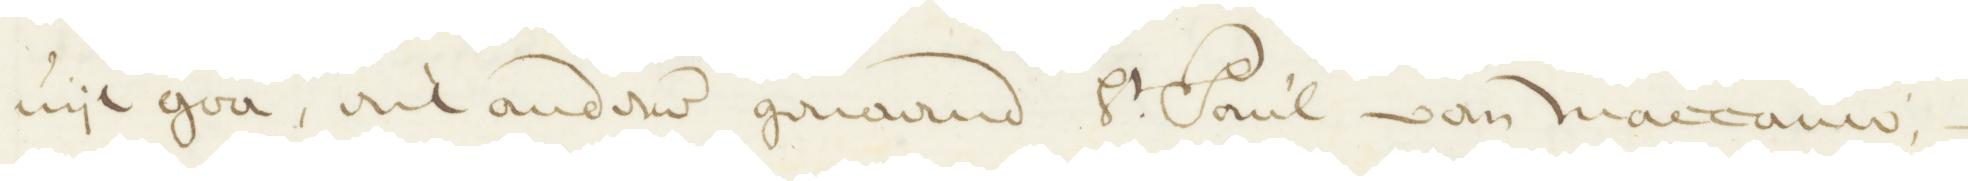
uijt goa, en't andere genaemd S.t Paul van maccauw,
